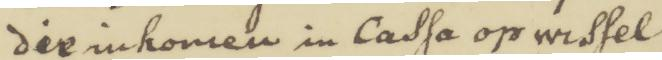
die inkomen in Cassa op wissel
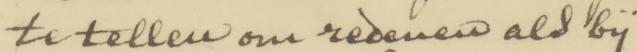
te tellen om redenen als bij
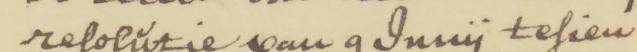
resolutie van 9 Iunij tesien
